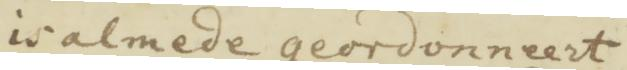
is almede geordonneert
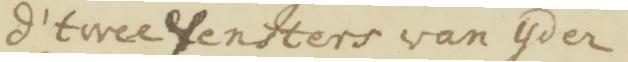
d’ twee vensters van yder
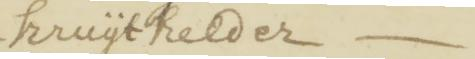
kruijtkelder -
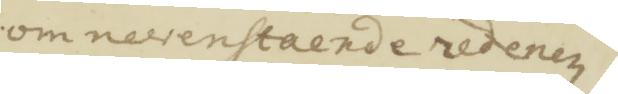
om nevenstaende redenen
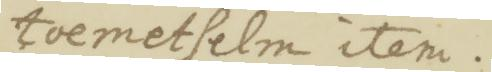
toemetselm item.
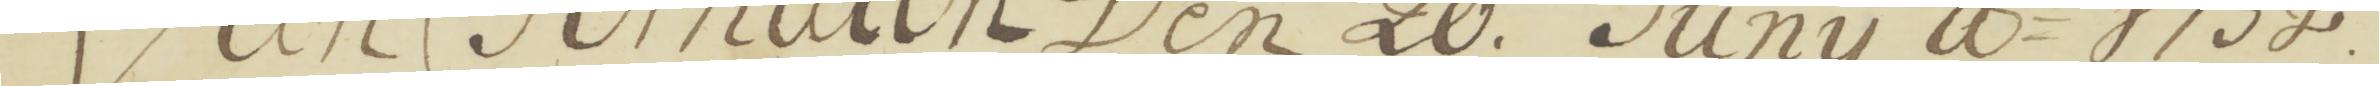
Van Ternaten Den 20.' Iunij a=o 1732.
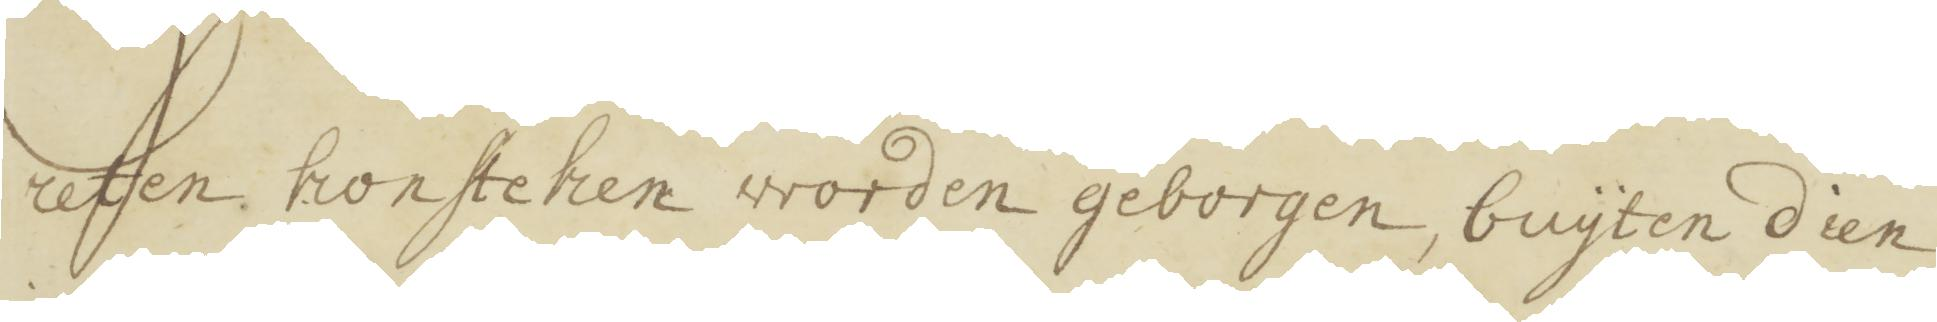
reten korsteken worden geborgen, buijten dien
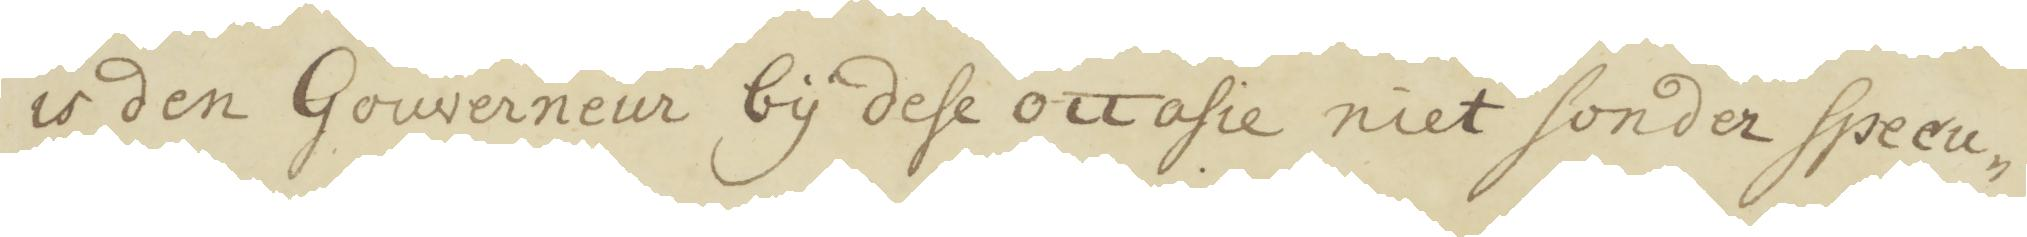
is den Gouverneur bij dese occasie niet sonder specu„
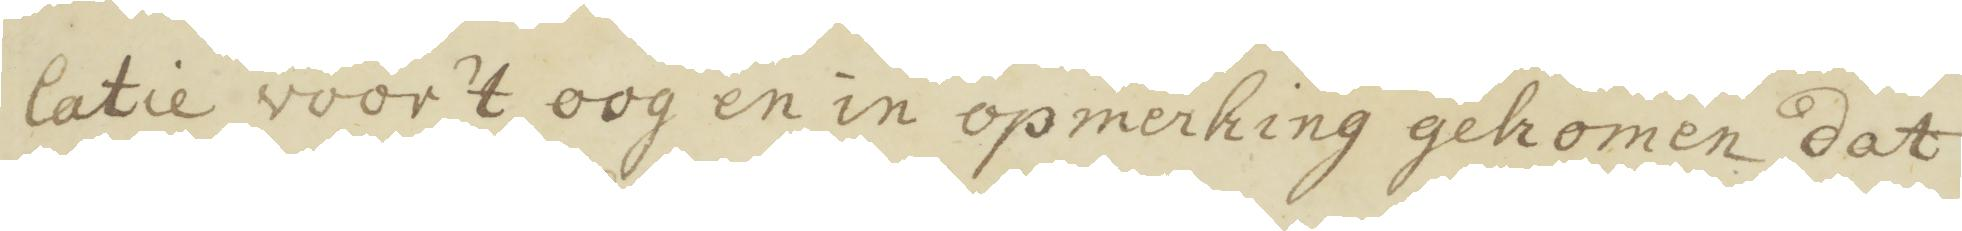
latie voor ’t oog en in op merking gekomen dat
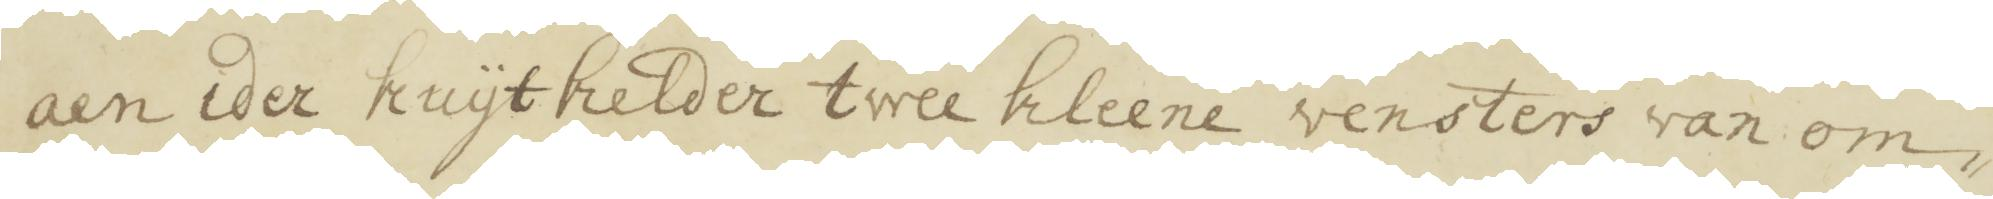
aen ider kuijtkelder twee kleene vensters van om„
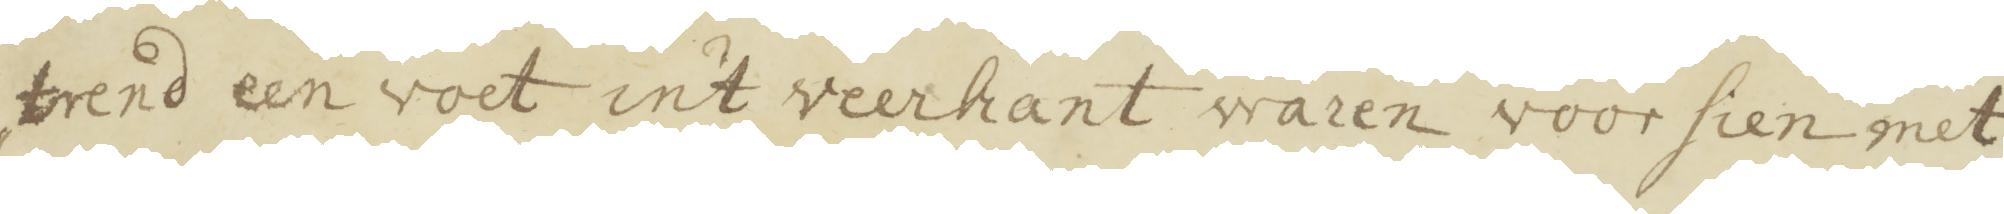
trend een voet in ’t veerkant waren voor sien met
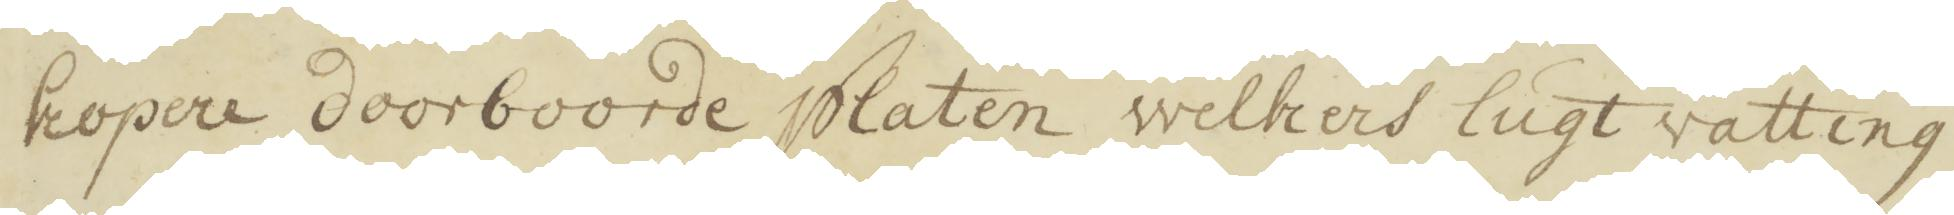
kopere doorboorde platen welkers lugt vatting
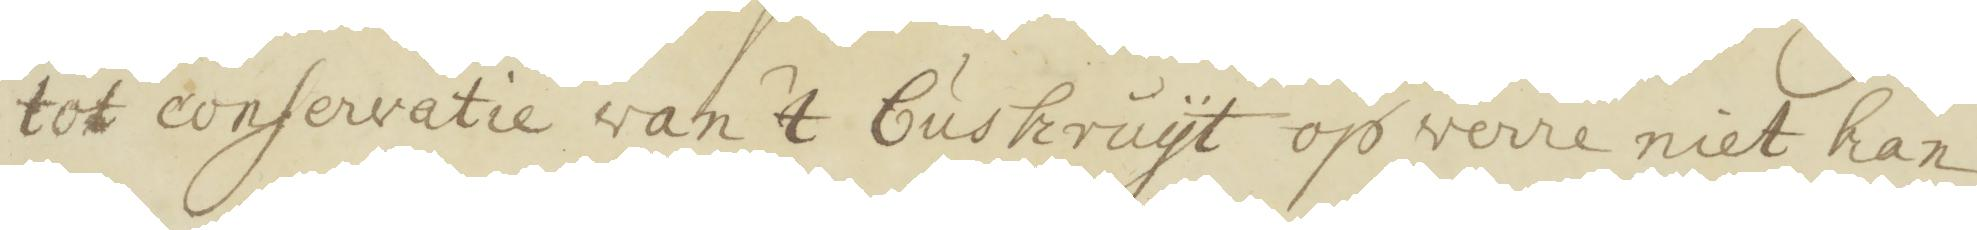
tot conservatie van ’t buskruijt op verre niet kan
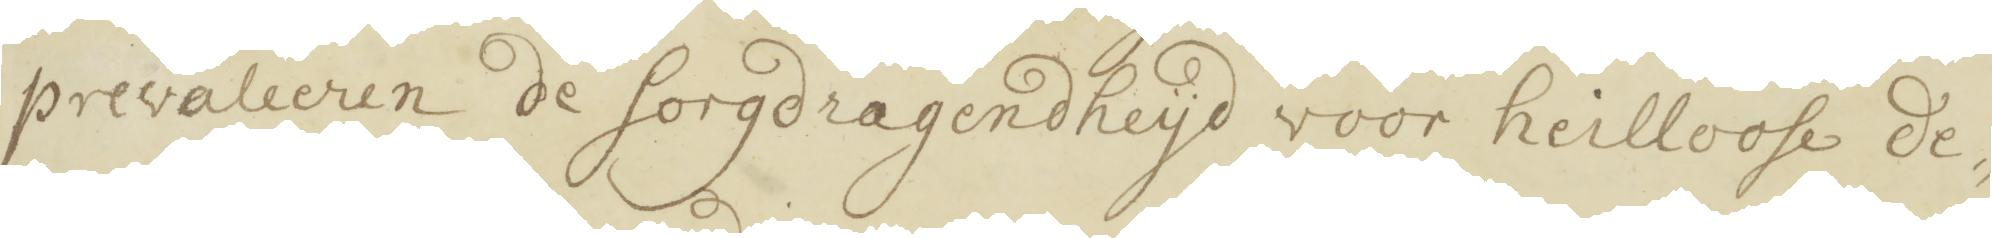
prevaleeren de Sorgdragendheijd voor heilloose de„
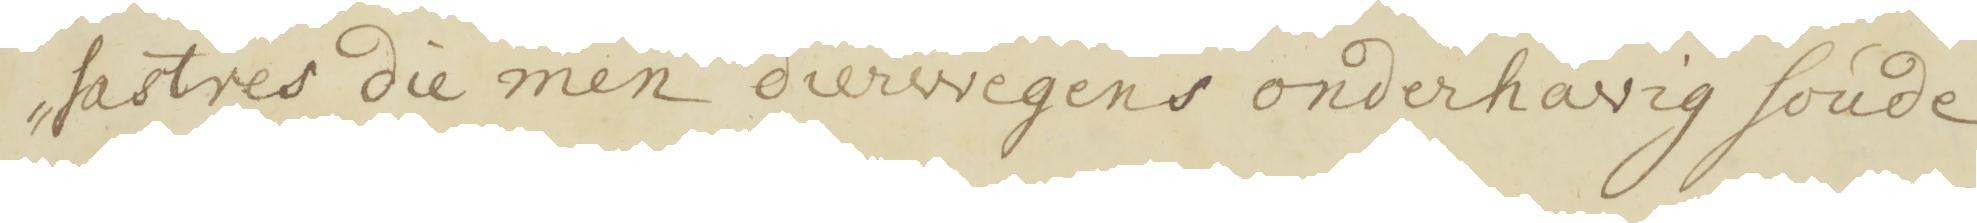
„sastres die men dierwegens onderhavig Soude
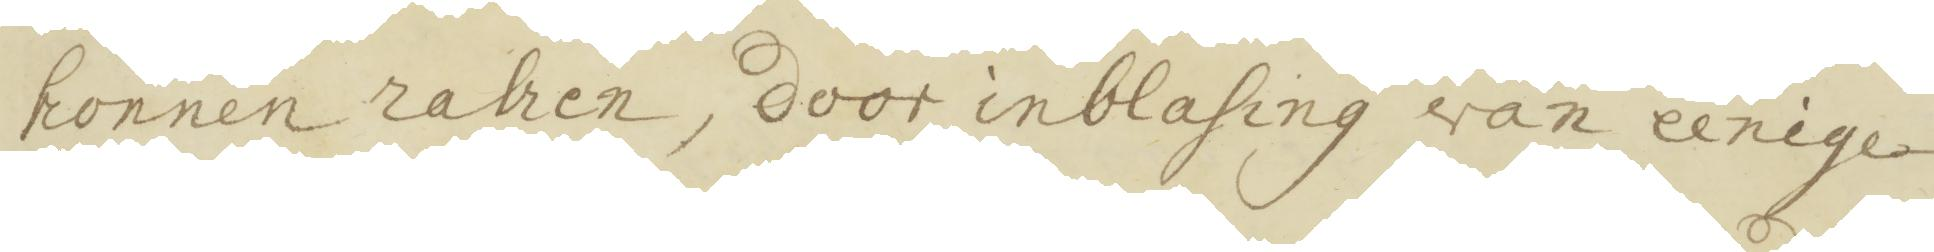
konnen raken, door inblasing van eenige
